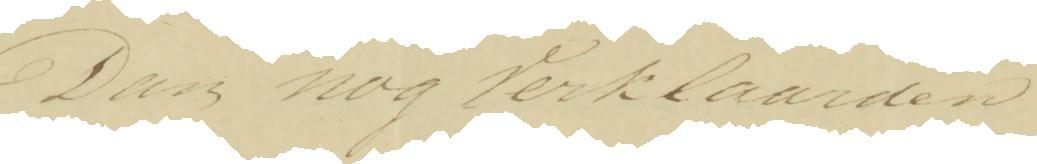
Dan nog Verklaarden
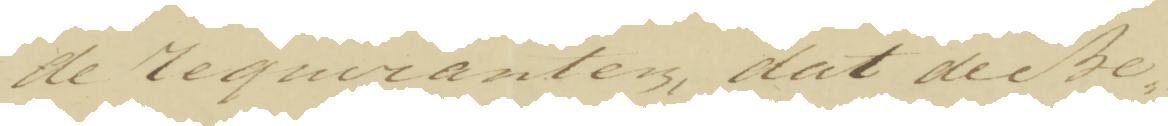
de requiranten, dat de Be„
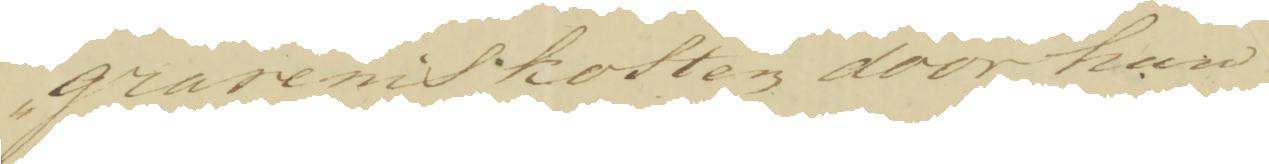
„gravenis kosten door hun
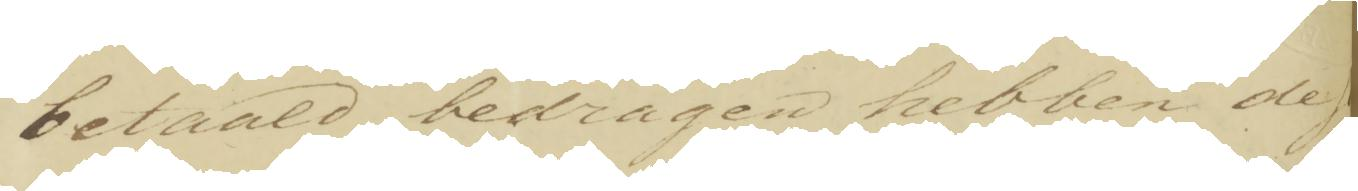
betaald, bedragen hebben de
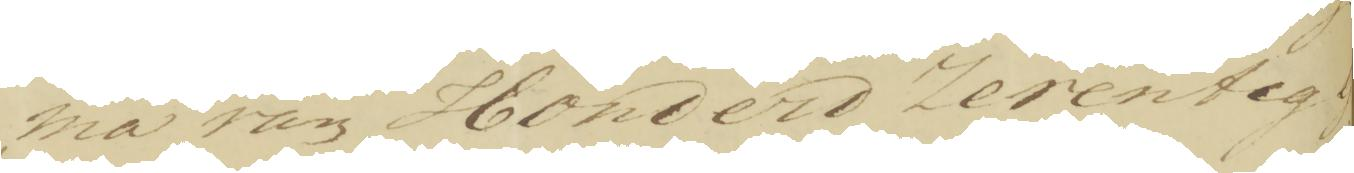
„ma van Honderd Zeventig
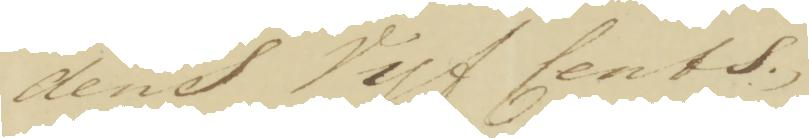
dens Vyf Cents.
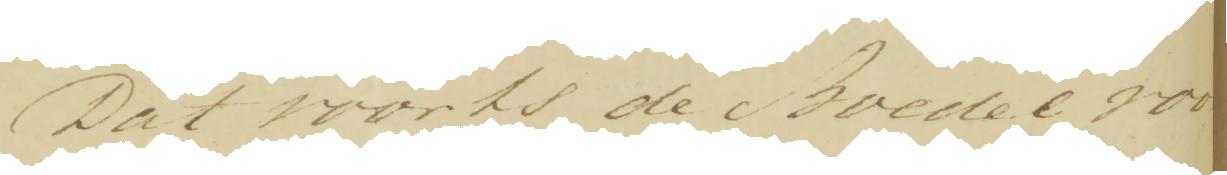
Dat voorts de Boedel voo
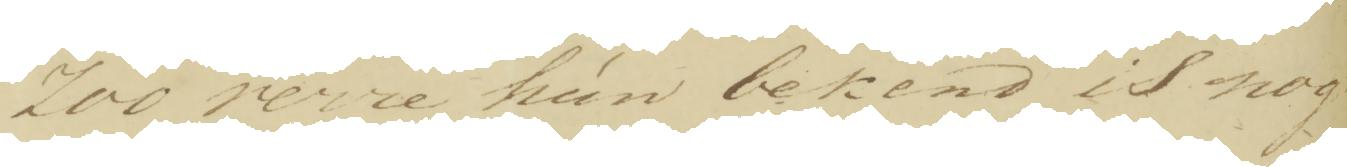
zoo verre hun bekend is nog
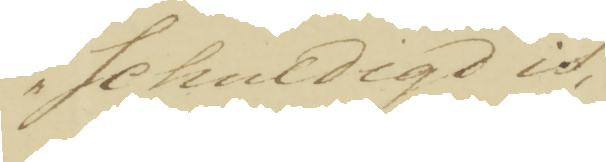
„schuldigd is.
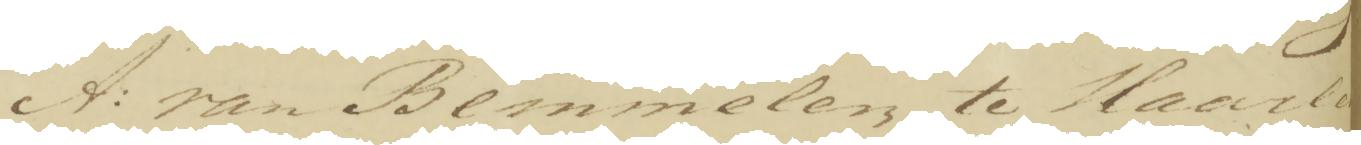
A: van Bommelen, te Haarle
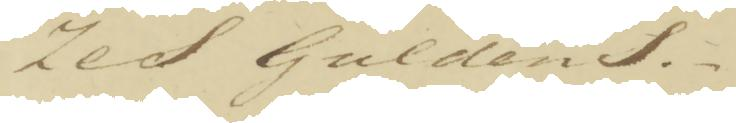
Zes Guldens.-
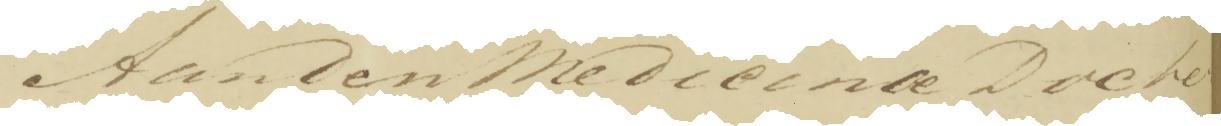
Aan den Medicinae Docte
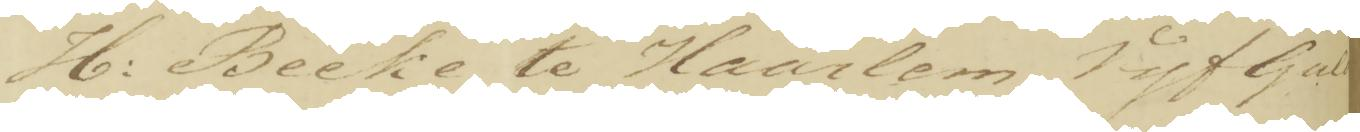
H: Beeke te Haarlem Vijf Gul
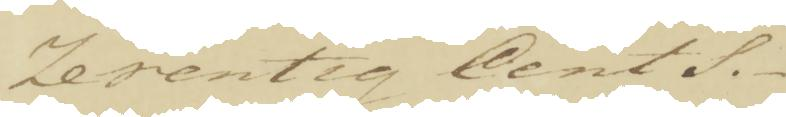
Zeventig Cents.-
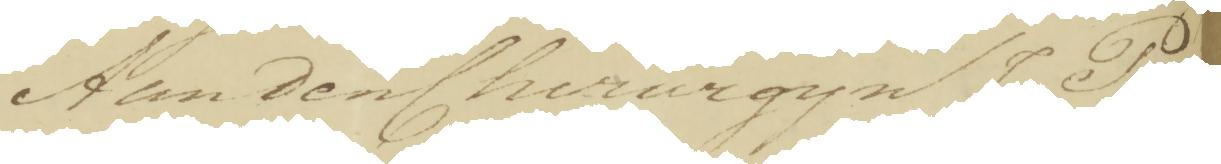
Aan den Chrirugyn J. Puy
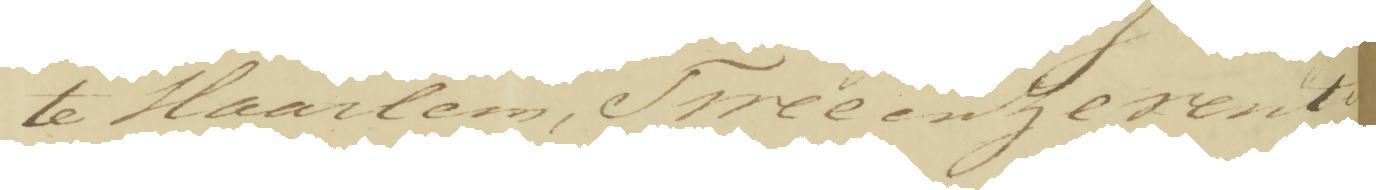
te Haarlem, Twee en Zeventi
